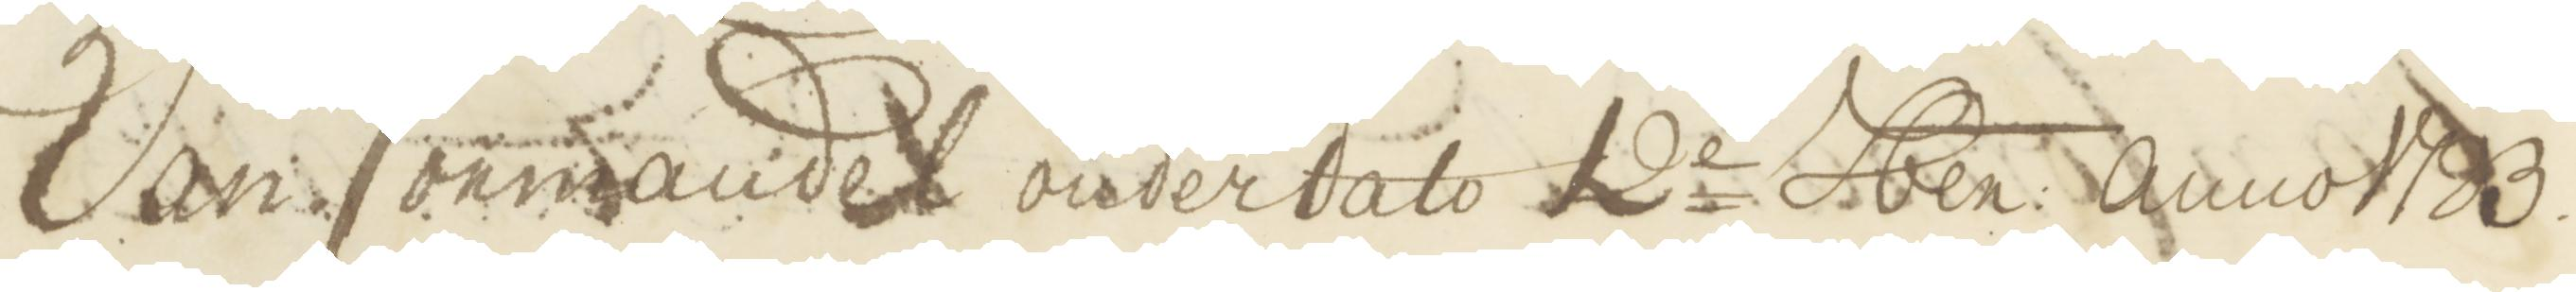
Van Cormandel onder dato 12=e 7ber: Anno 1733.
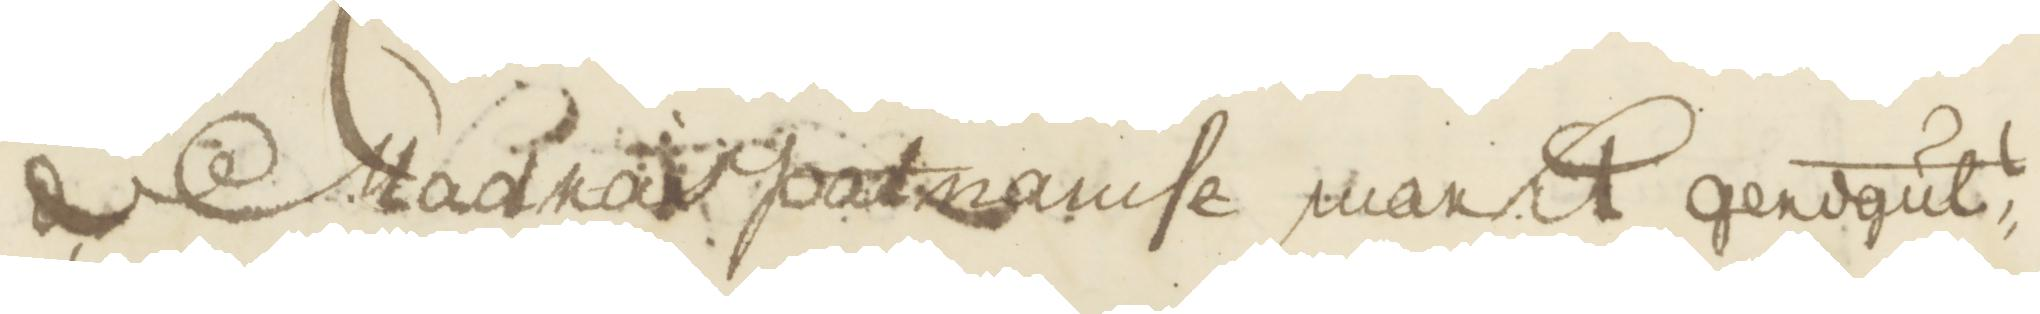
de Mandraspatnamse markt geregul„t
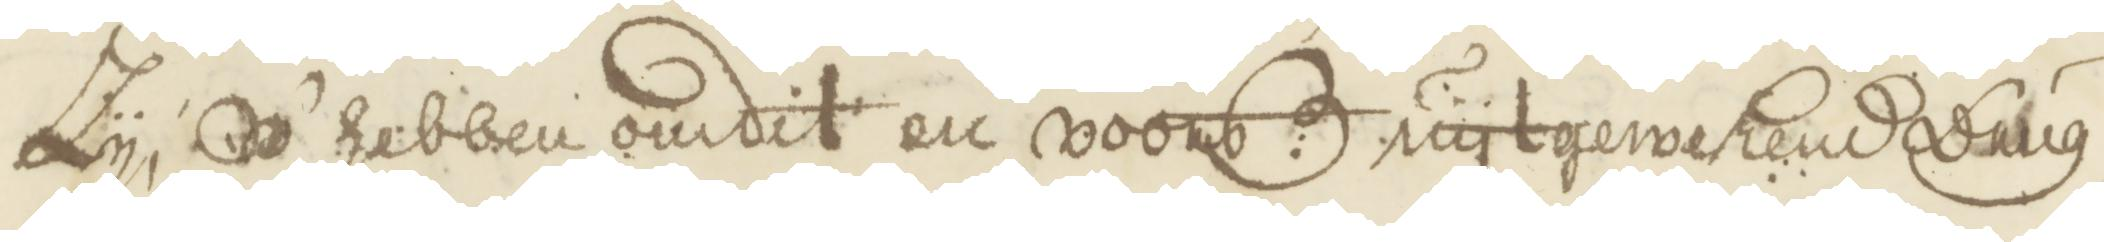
zij, w' hebben om dit en voors: uijtgewekene terug
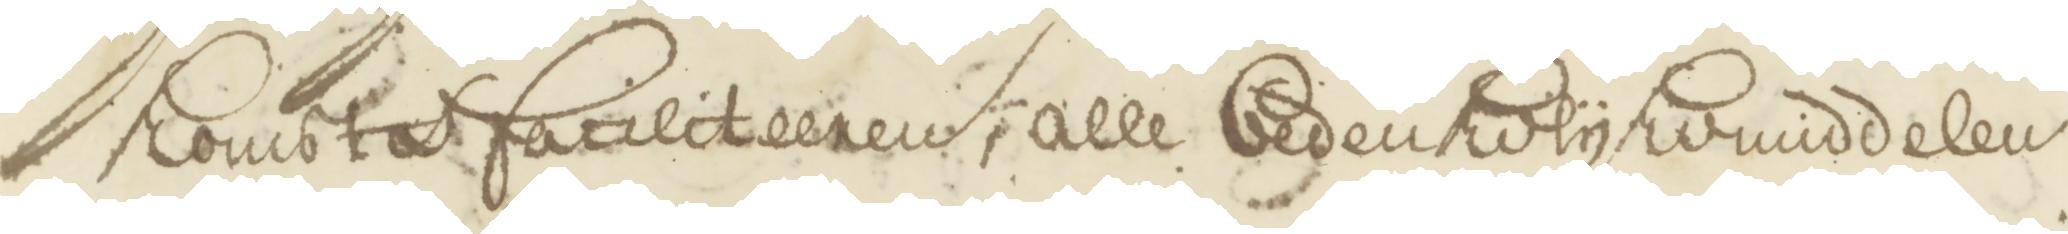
komst te faciliteeren, alle bedenkelijke middelen
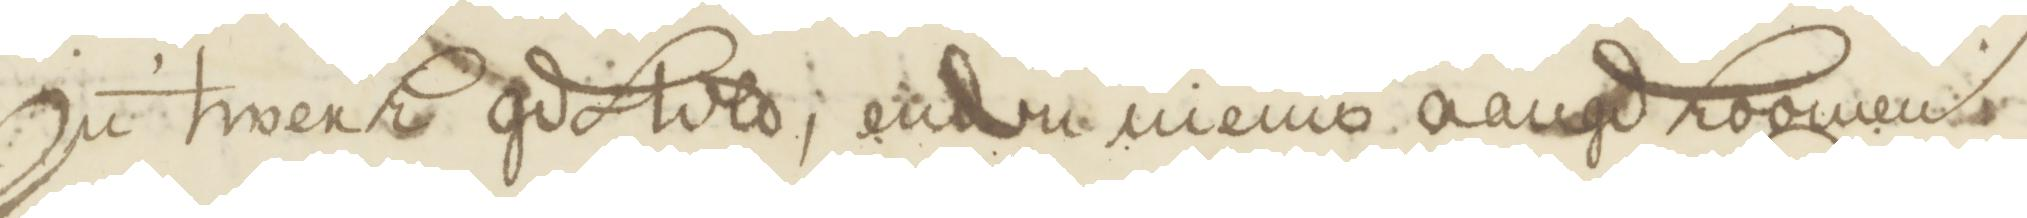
jn 't werk gesteld; en den nieuw aangekoomen
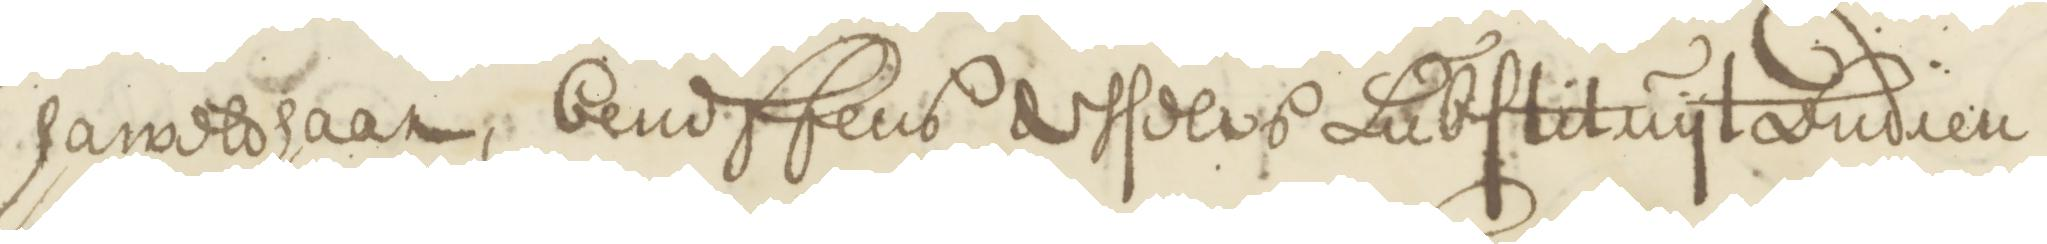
haweldhaar, beneffens desselvs substituijt tendien
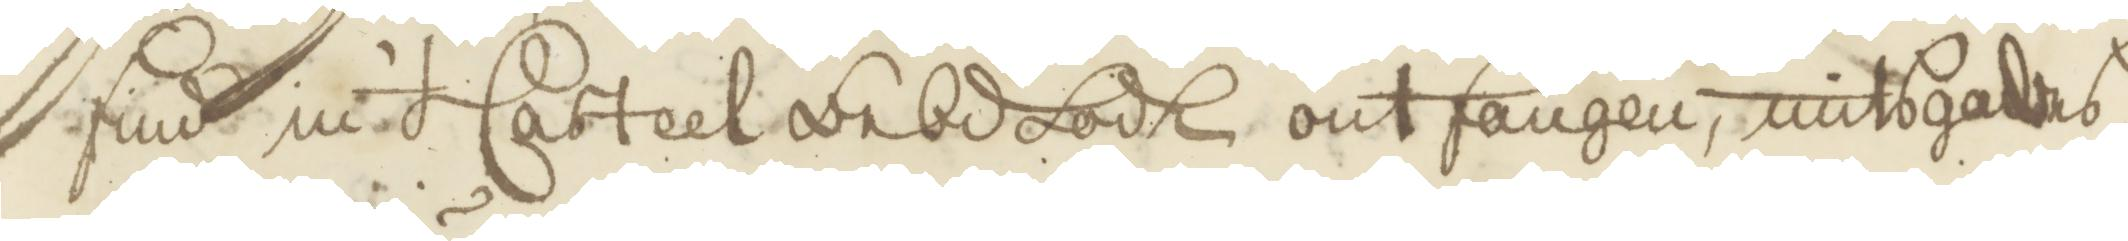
Einde in 't Casteel terbesoek ontfangen, mitsgaders
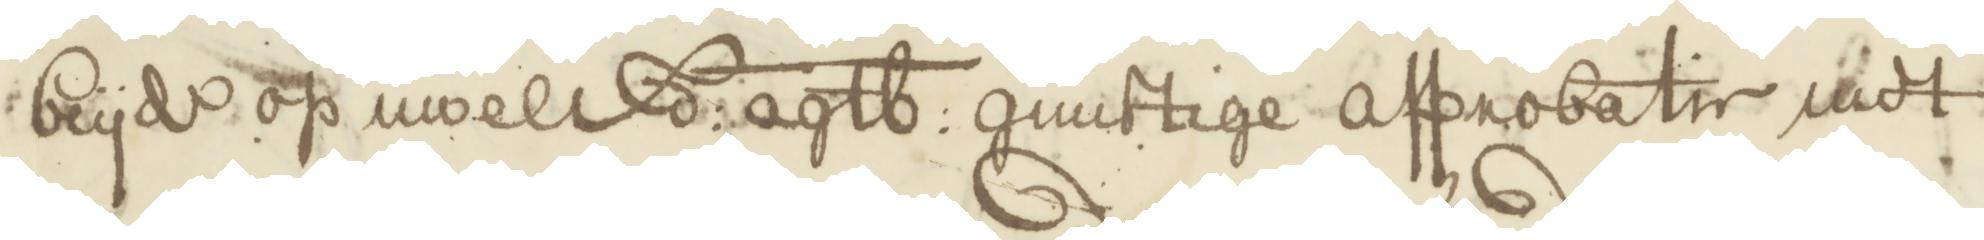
beijde op uwel Ed: agtb: gunstige approbatie met
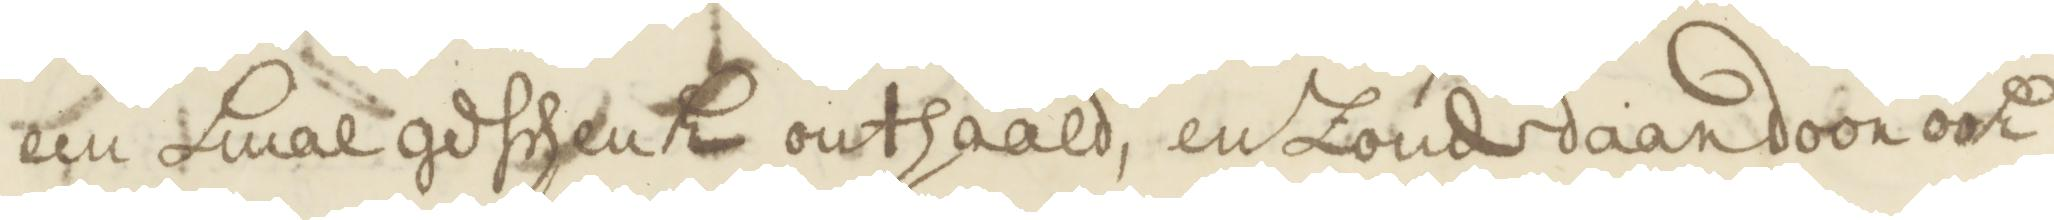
een smal geschenk onthaald, en zoude daar daar ook
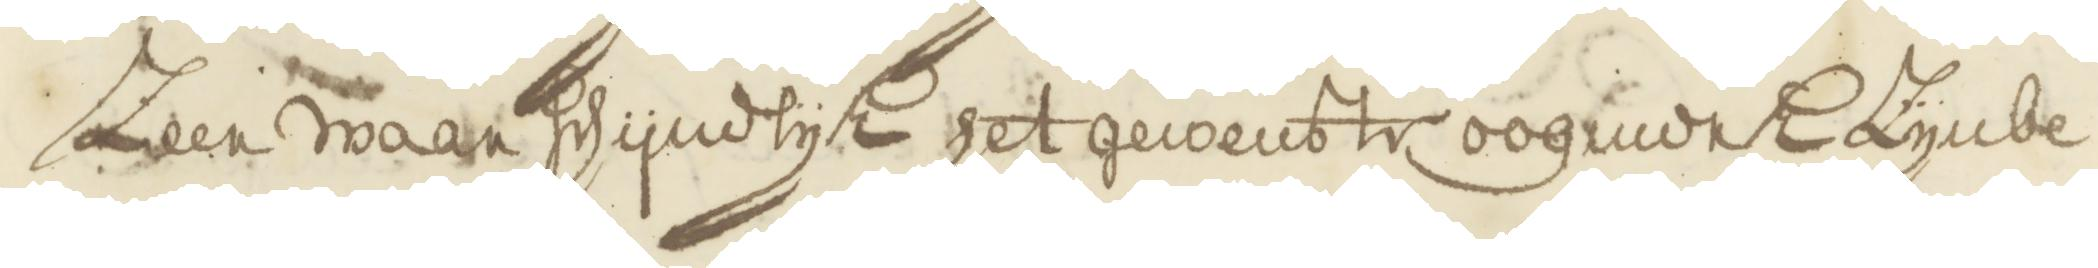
zeer waar schijnelijk het gewenste oogmerk zijnbe
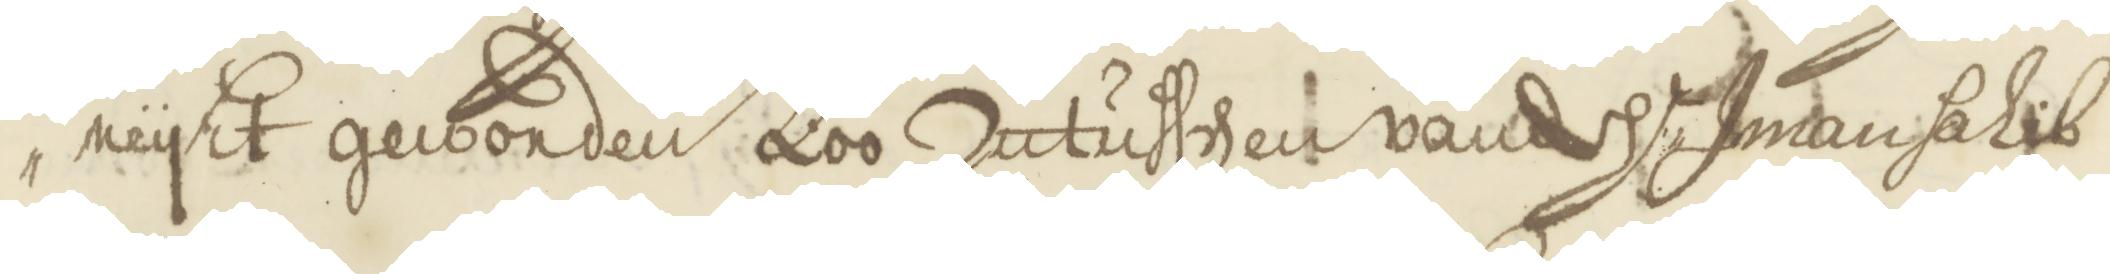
„ reijht geworden zoo jntusschen van de h„r Jman sahib
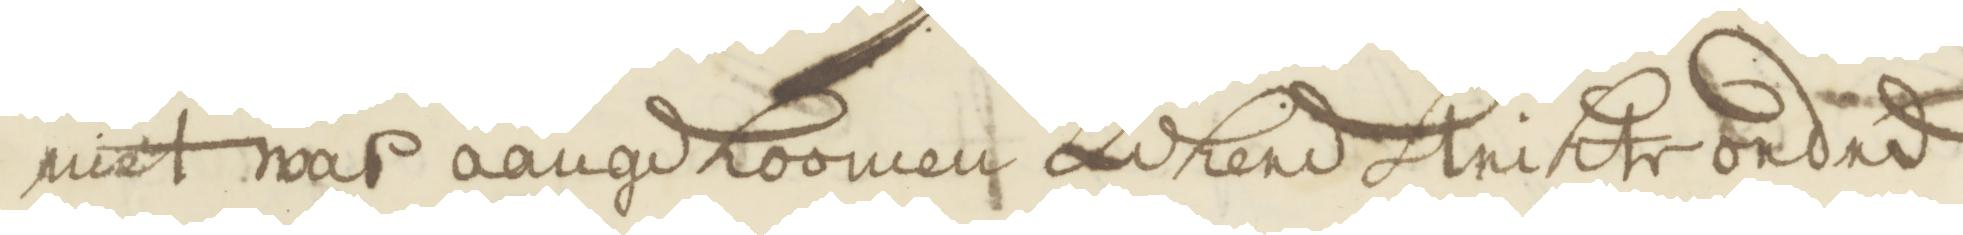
niet was aangekoomen zekerd strikte ordre
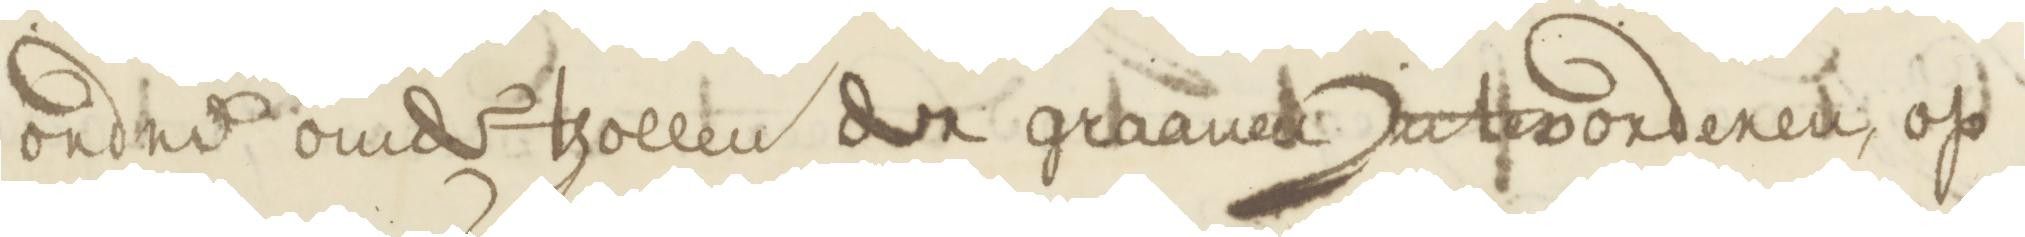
ordre omde thollen der graanen jntevorderen, op
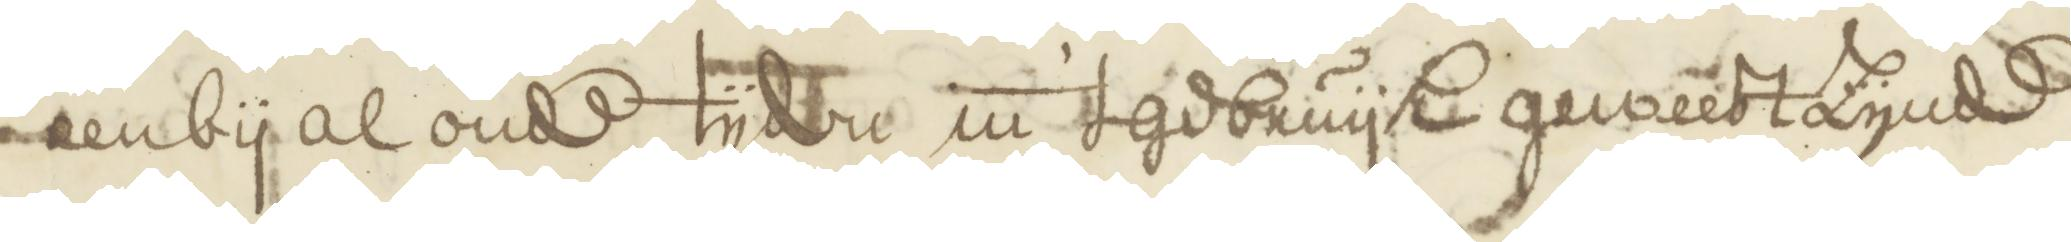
eenbij al oude tijden in ’tgebruijk geweest zijnde
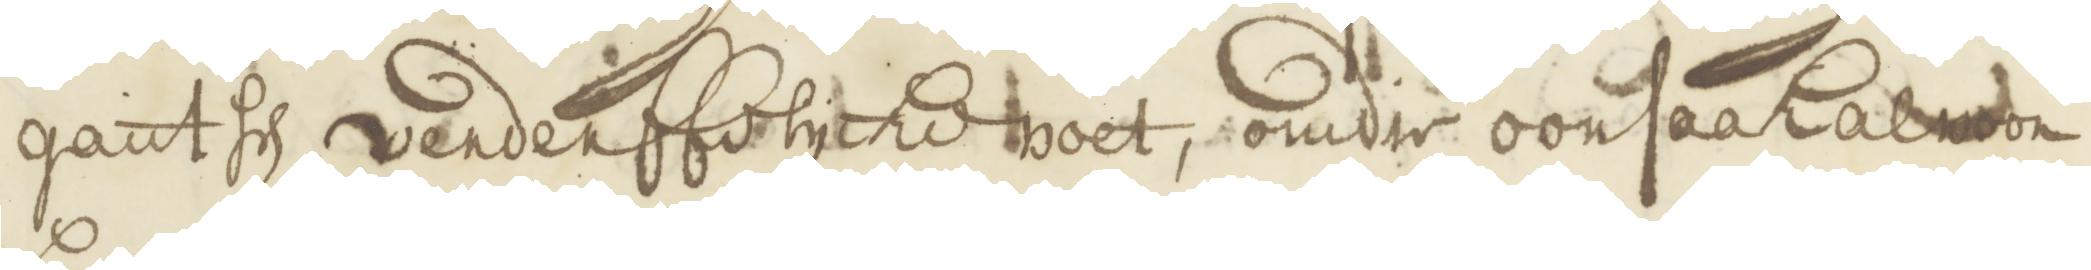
gantsch verderffelijcke voet, omdie oorsaak alvoor
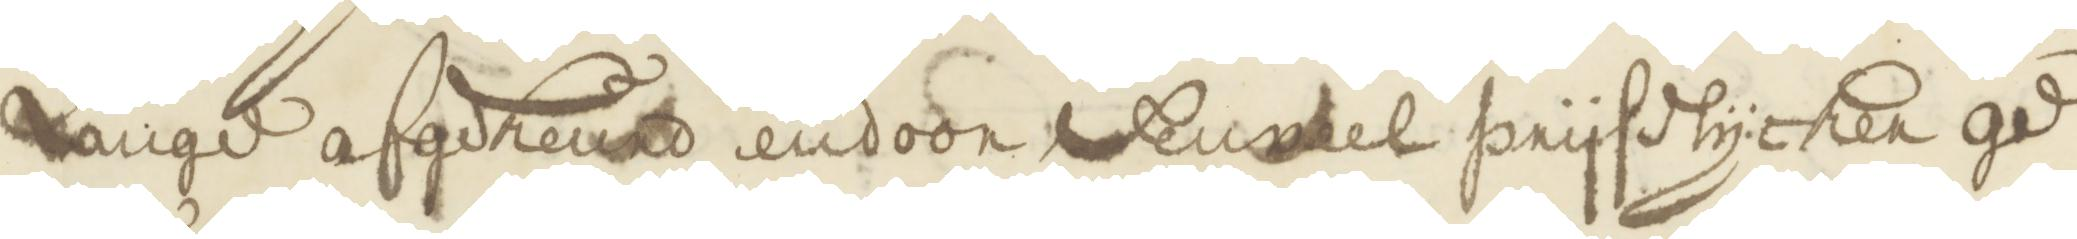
Lange afgekeurd endoor Eenveel prijselijcker ge
